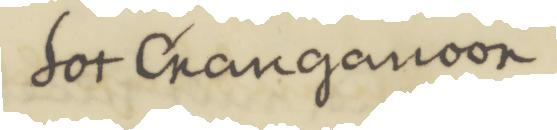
tot Cranganoor
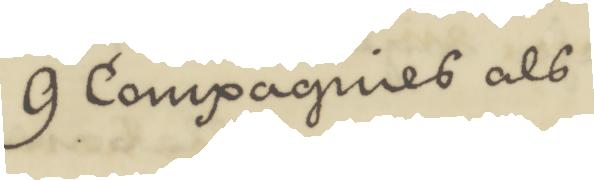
9 Compagnies als
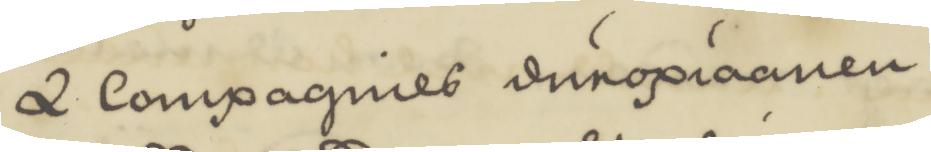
2 compagnies europiaanen
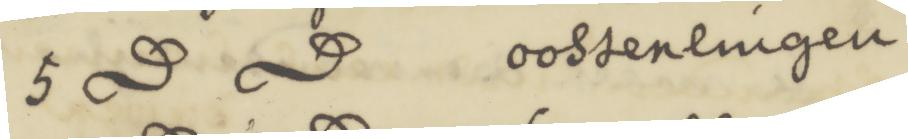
5 do do oosterlingen
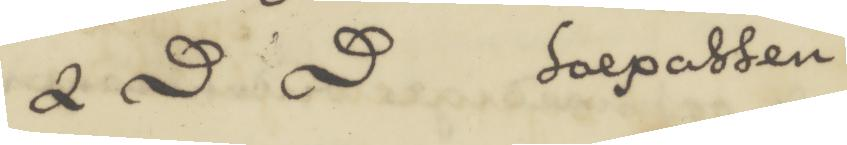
2 do do toepassen
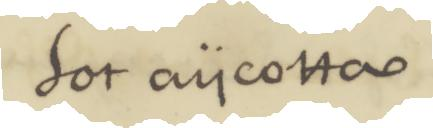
tot aijcotta
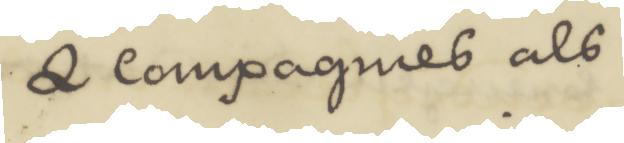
2 compagnies als
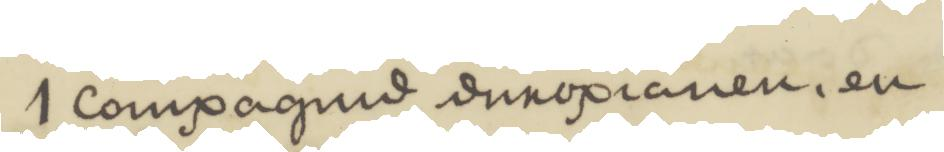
1 compagnie europianen, en
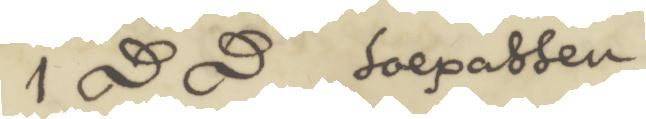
1 do do toepassen
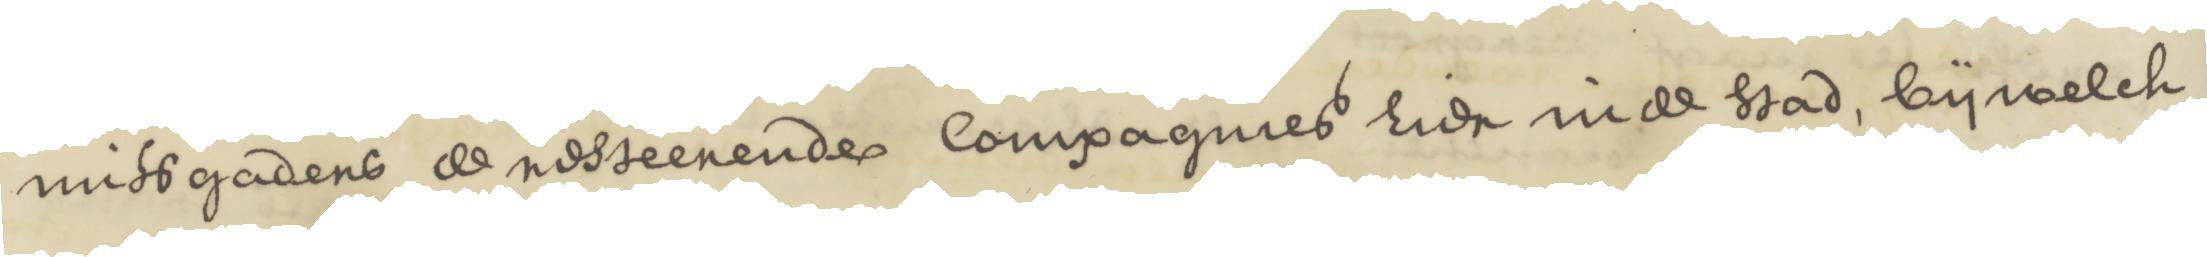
mitsgaders de resteerende compagnies hier in de stad, bij welck
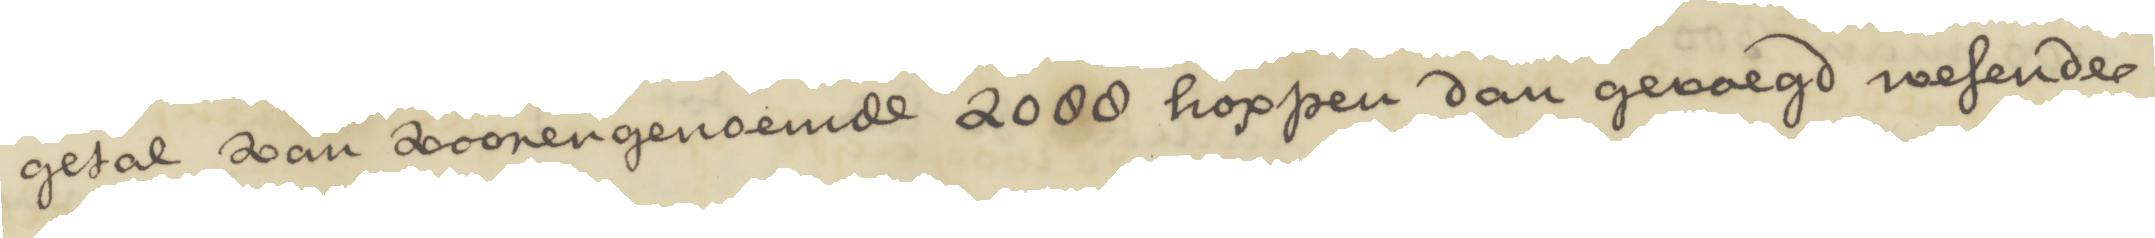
getal van voorengenoemde 2088 koppen dan gevoegd wesende
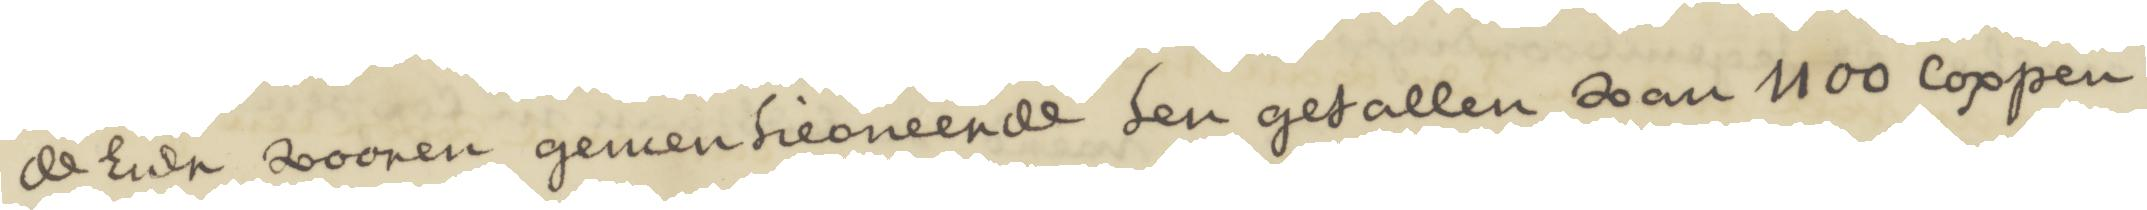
de hier vooren gementieoneerde ten getallen van 1100 coppen
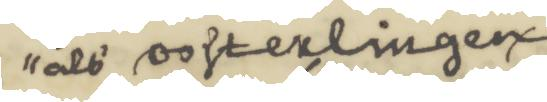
„als oosterlingen
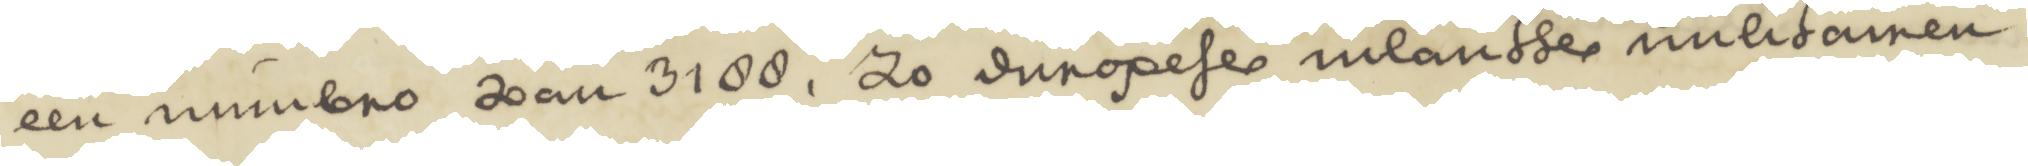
een numbro van 3188. zo europese „ inlantse militairen
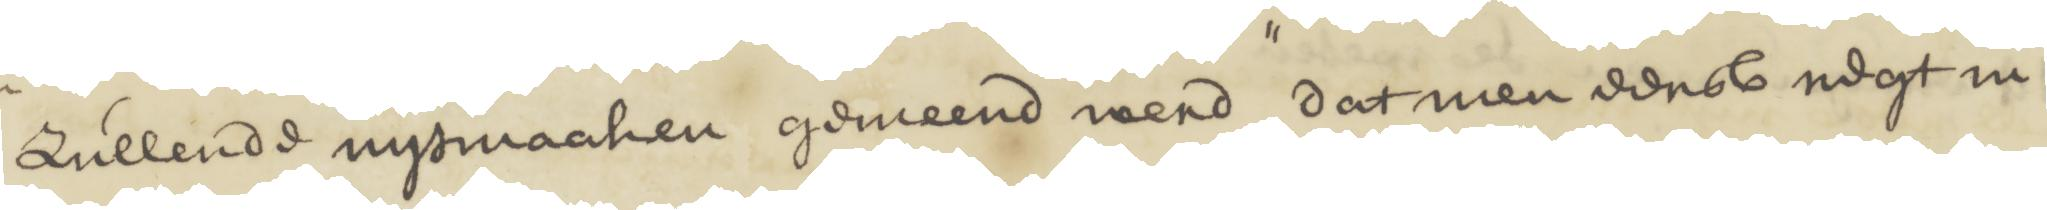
zullende uijtmaaken gemeend werd dat men eerst regt in
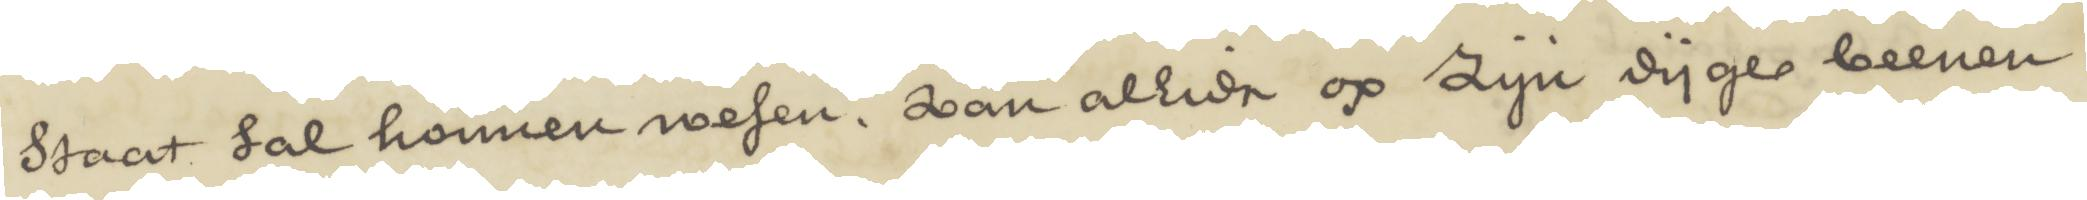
staat sal konnen wesen, van alhier op zijn eijge beenen
